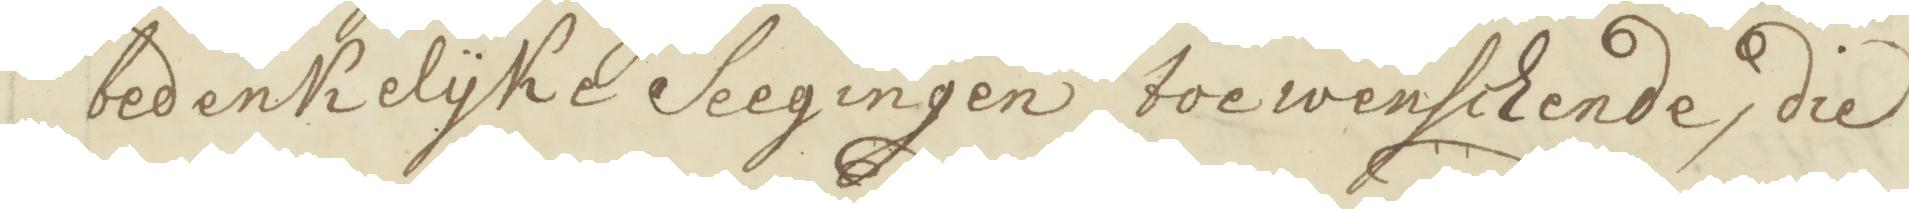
bedenkelijke seegingen toe wenschende, die
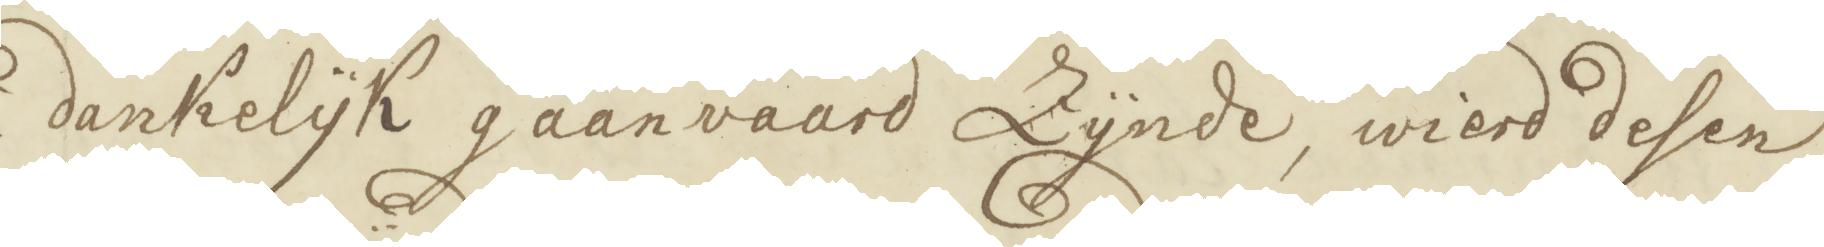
dankelijk g'aanvaard zijnde, wierd desen
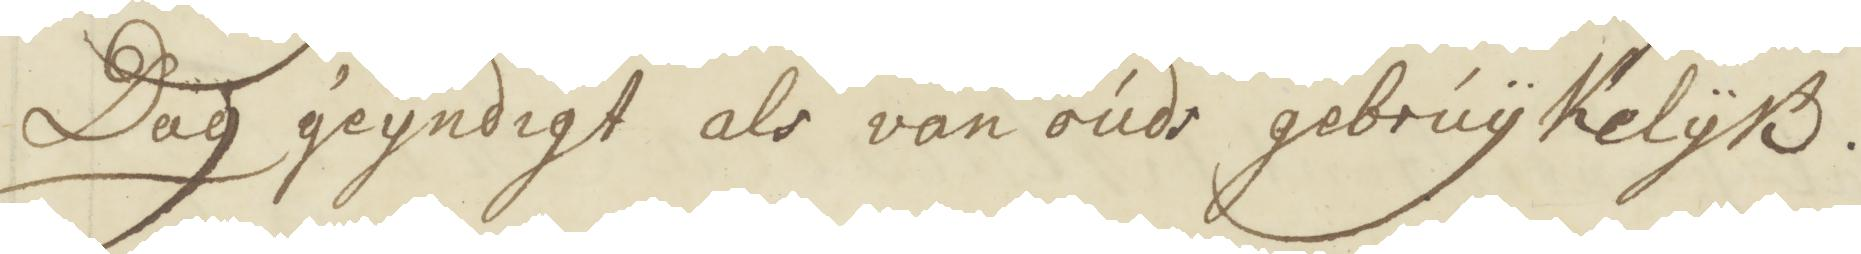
Dag g'eijndigt als van ouds gebruijkelijk.
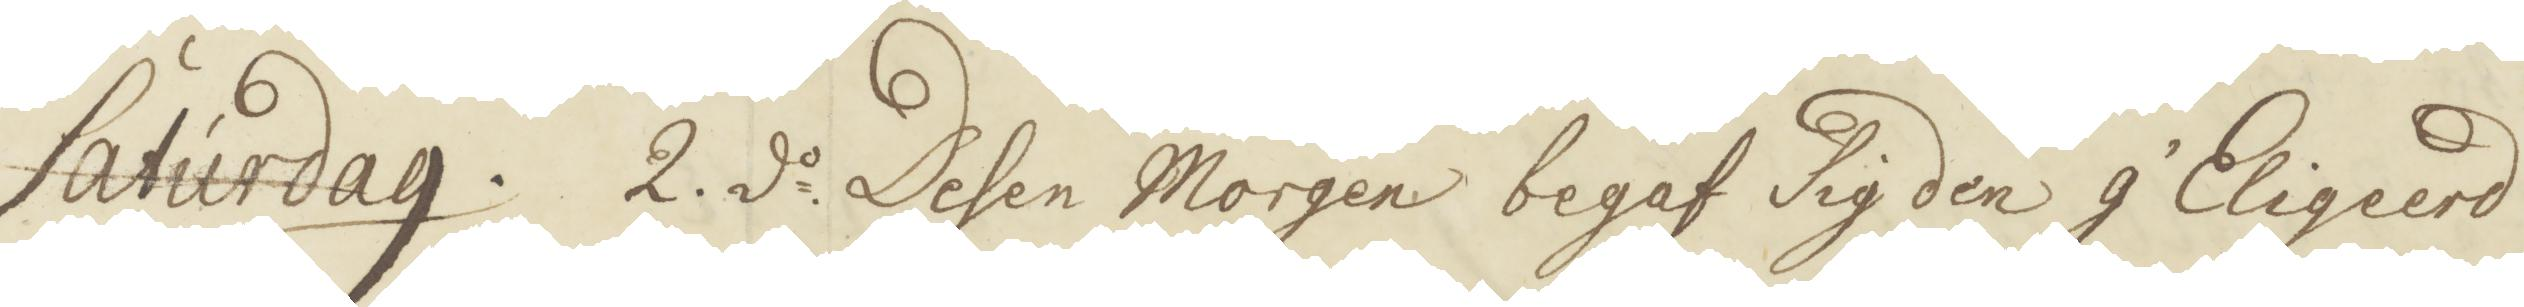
Saturdag. 2: d=o. Desen Morgen begaf sig den g’Eligeerd
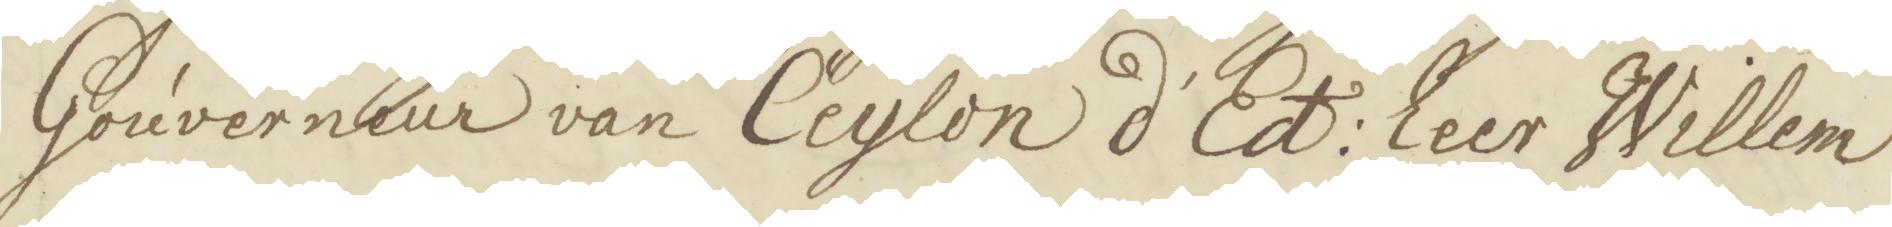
Gouverneur van Ceijlon d’ Ed: heer Willem
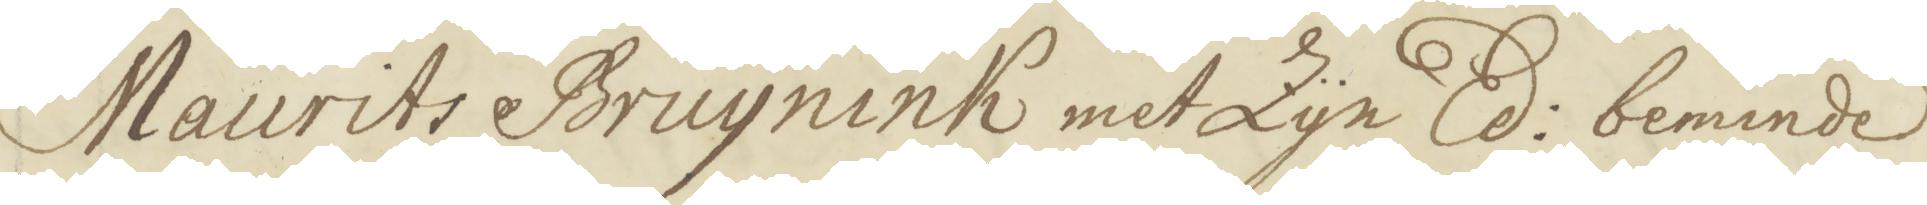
Maurits Bruijnink met zijn Ed: beminde
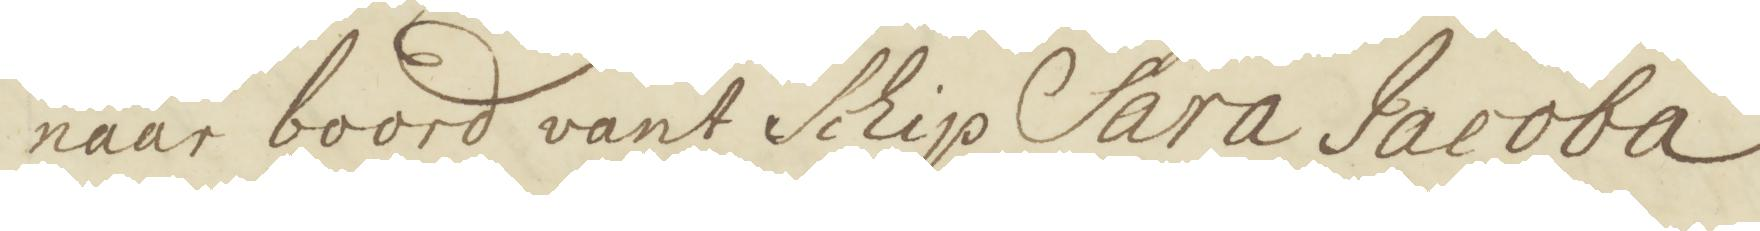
naar boord van't schip Sara Jacoba
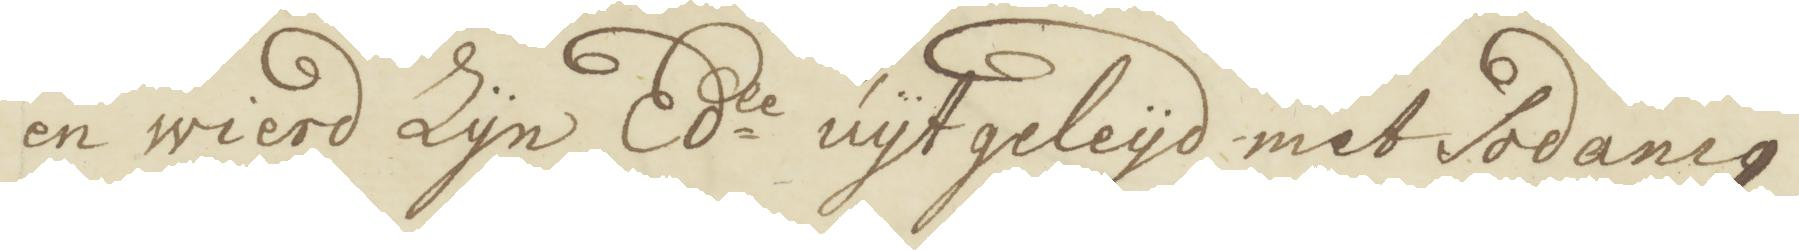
en wierd zijn Ed=le uijt geleijd met sodanig
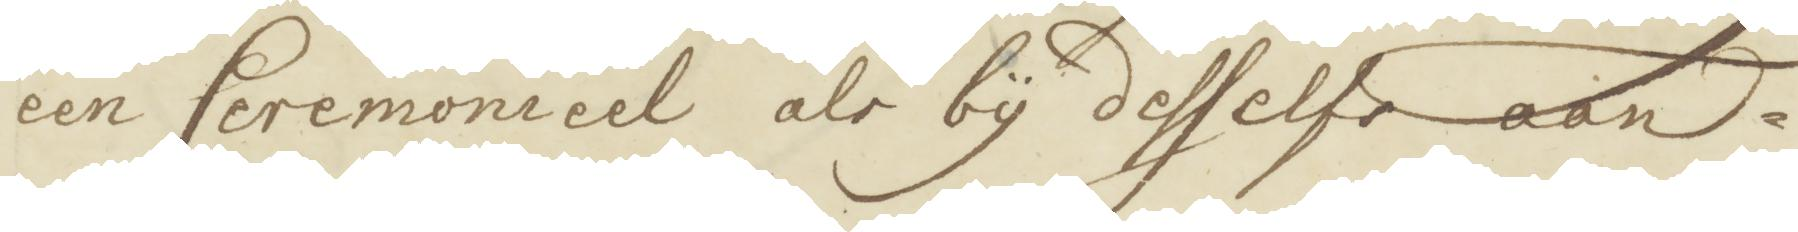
een ceremonieel als bij desselfs aan.
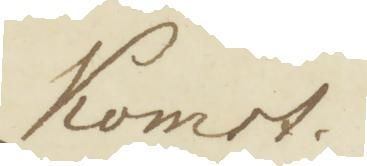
komst.
